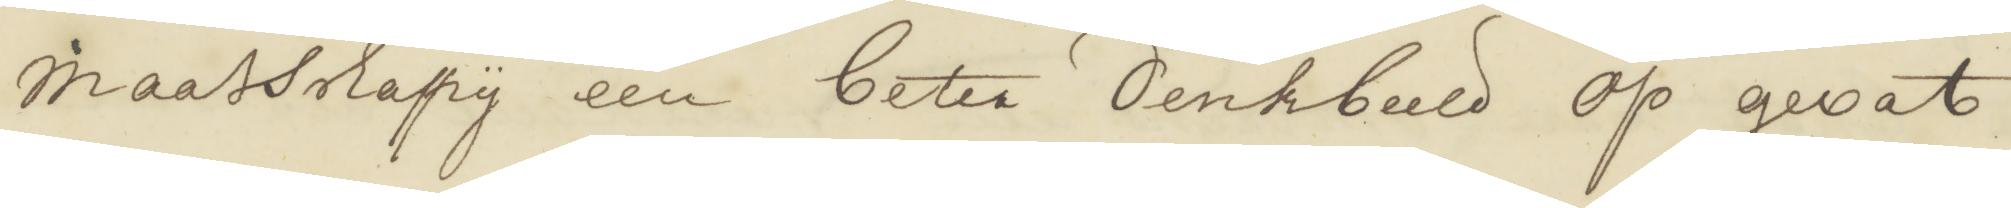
maatschappij een beter denkbeeld op gevat
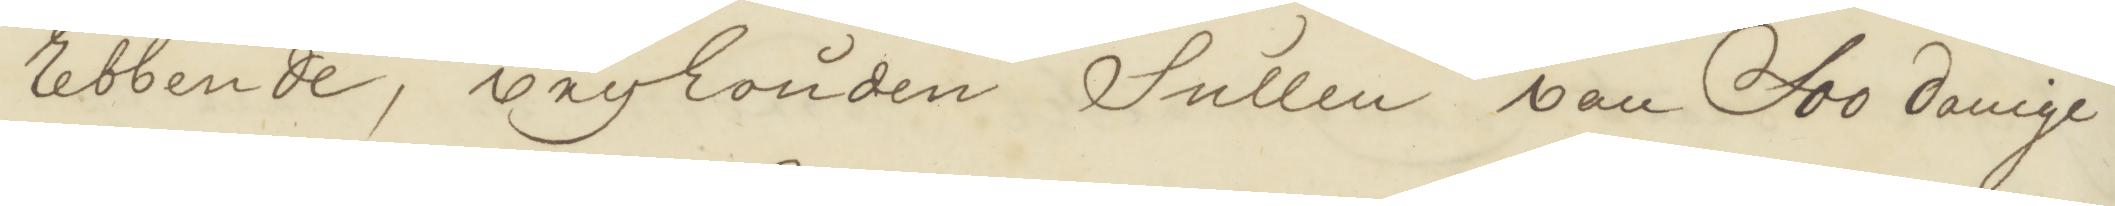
hebbende, vrijhouden Sullen van Soo danige
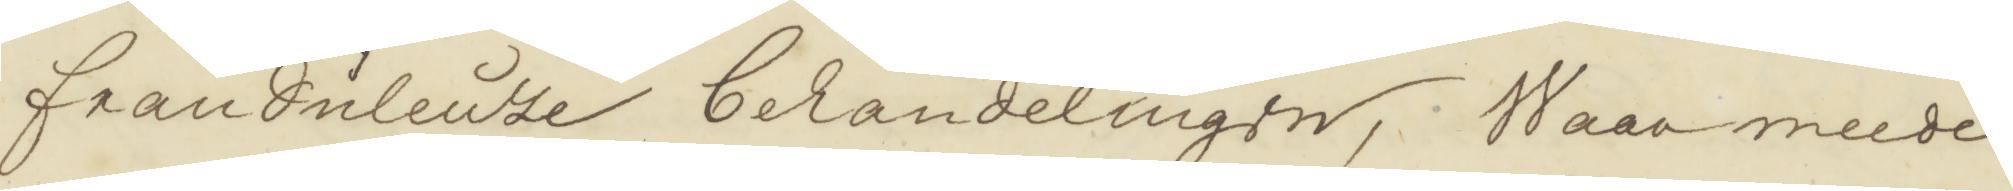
frauduleuze behandelingen, Waar meede
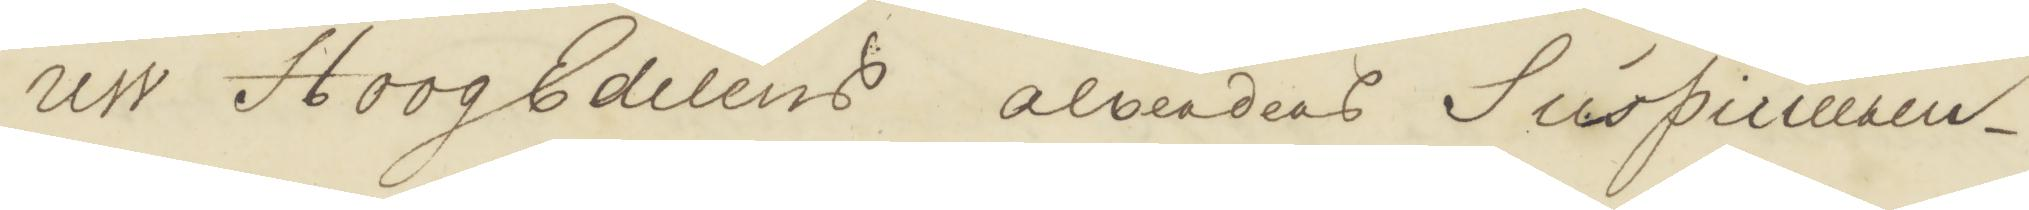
uw Hoog Edelens alverders Suspicieeren-
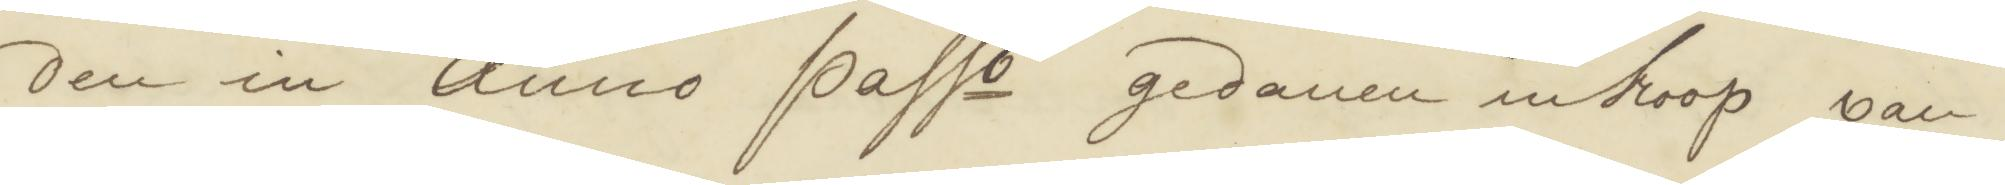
den in Anno pass=o gedanen inkoop van
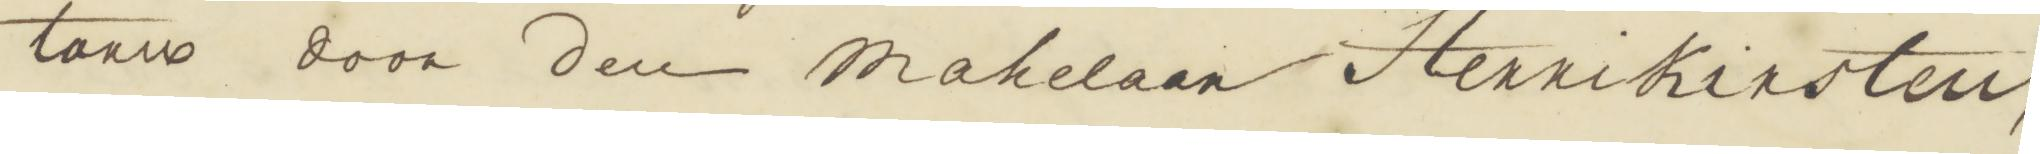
tarw door den makelaar Herrikirsten,
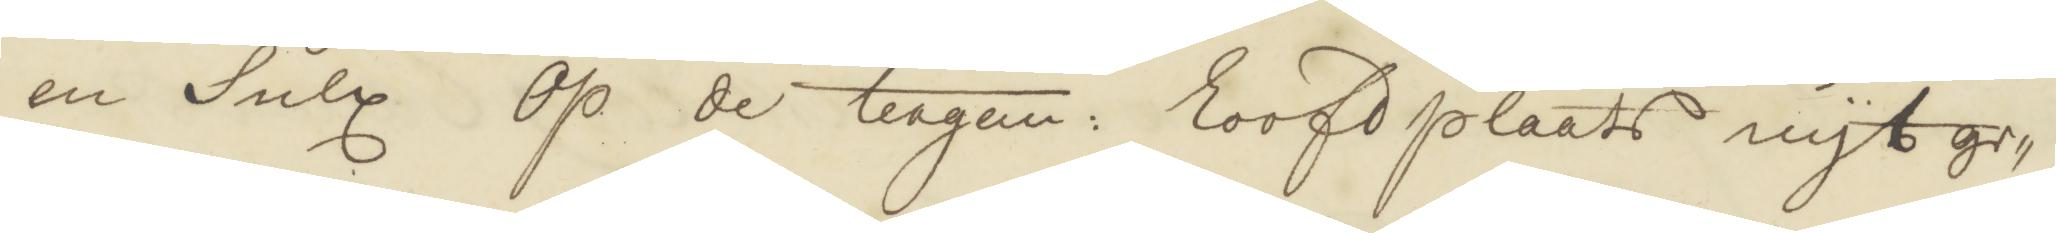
en Sulx op de tergem: hoofdplaats uijt ge„
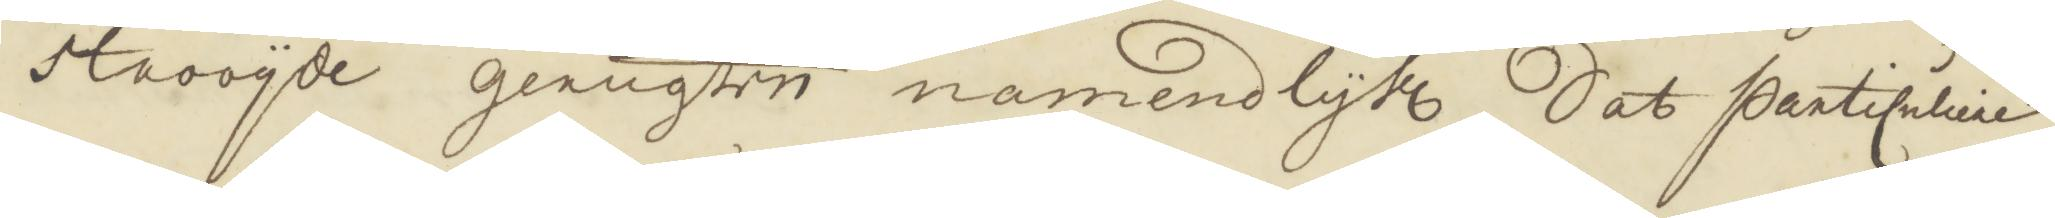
strooijde gerugten namendlijk dat particuliere
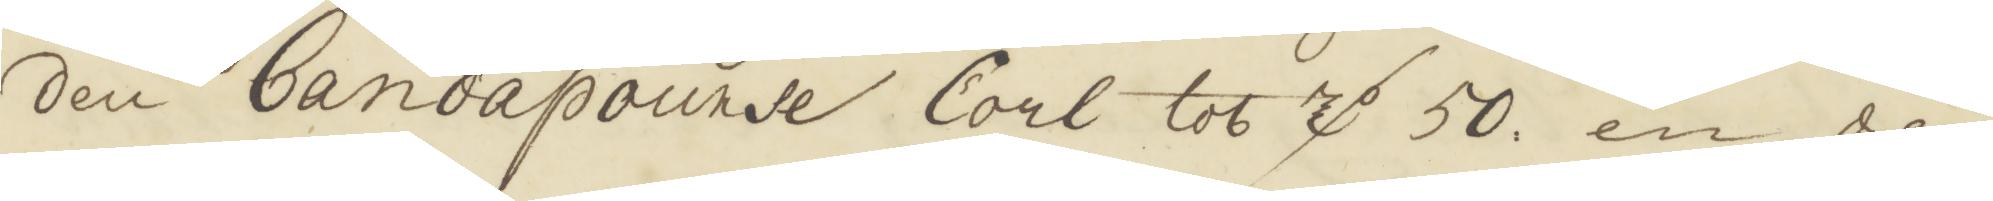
den bandapourse Corl tot r:o 50. en de
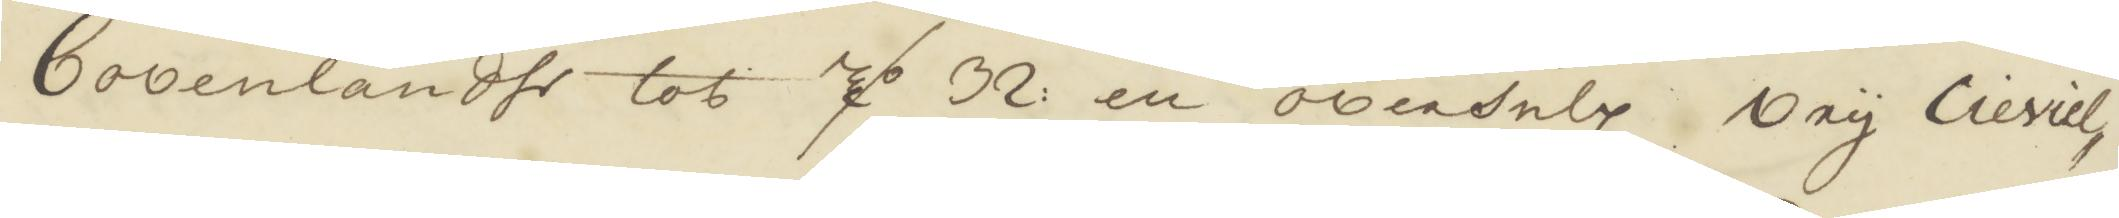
bovenlandse tot r:o 32: en oversulx vrij Cieviel„
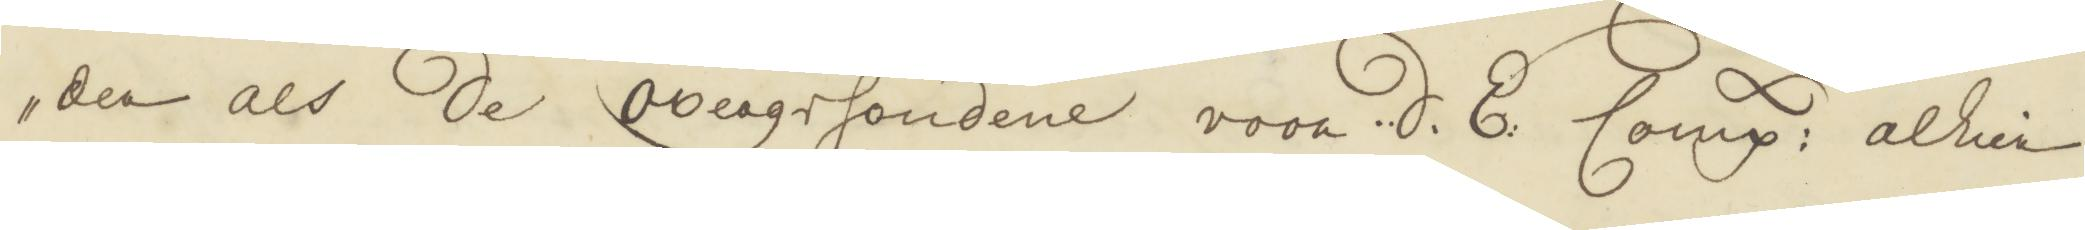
„der als de overgesondene voor d: E: Comp: alhier
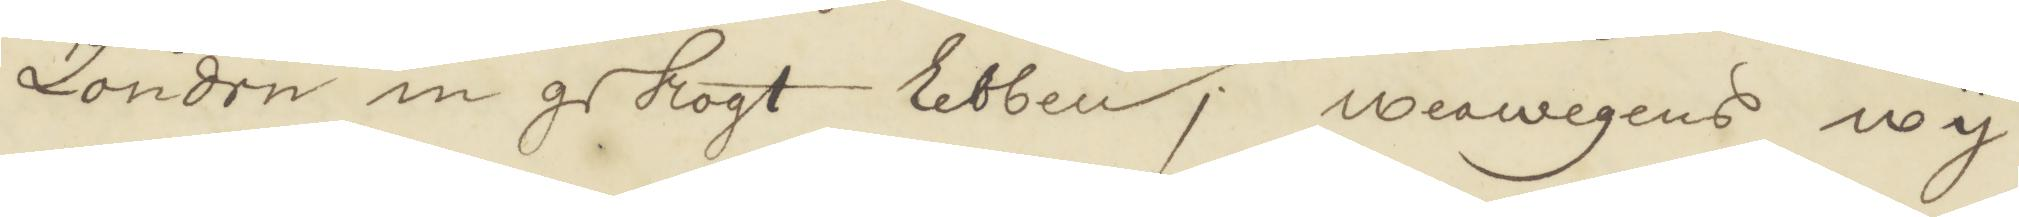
Zouden in gekogt hebben; werwegens wij
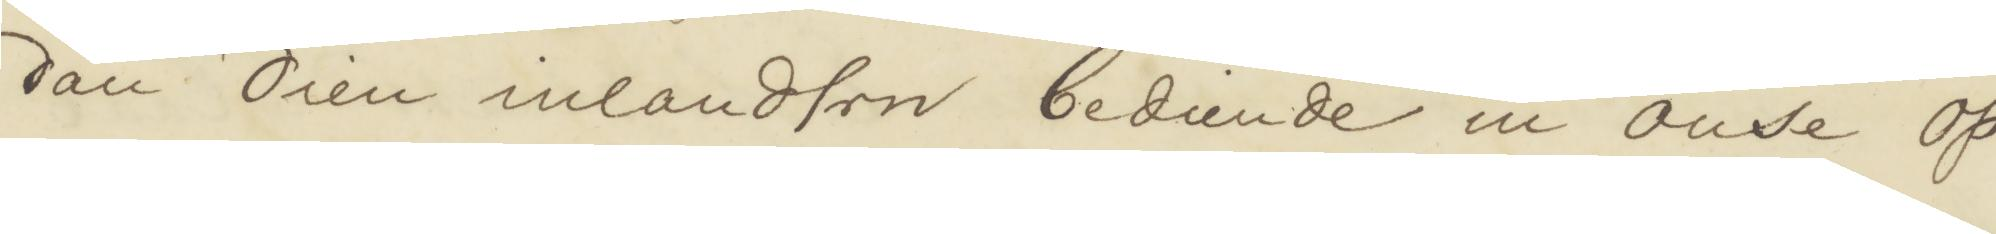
dan dien inlandsen bediende in onse op
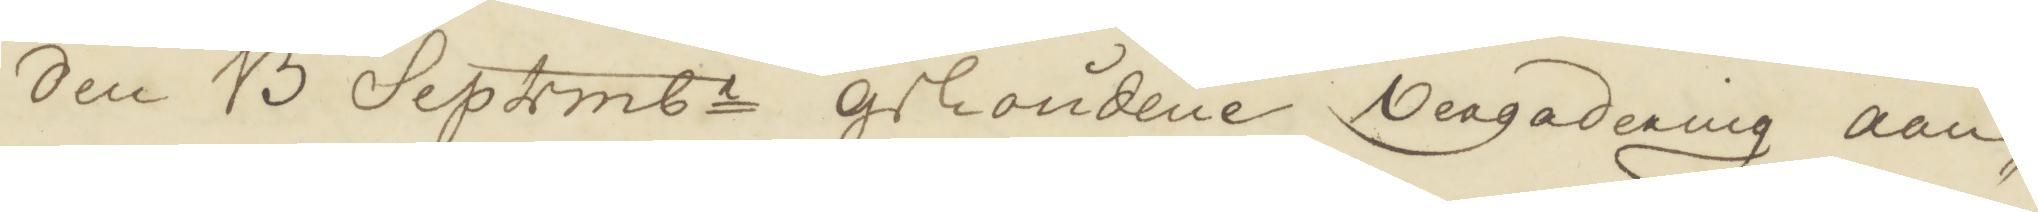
den 13 Septemb=r gehoudene vergadering aan„
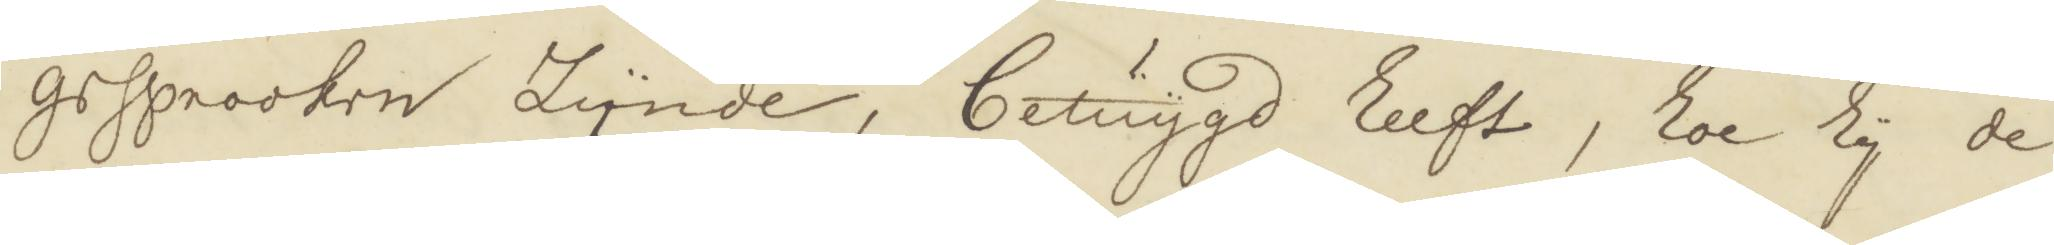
gesprooken Zijnde, betuijgd heeft, hoe hij de
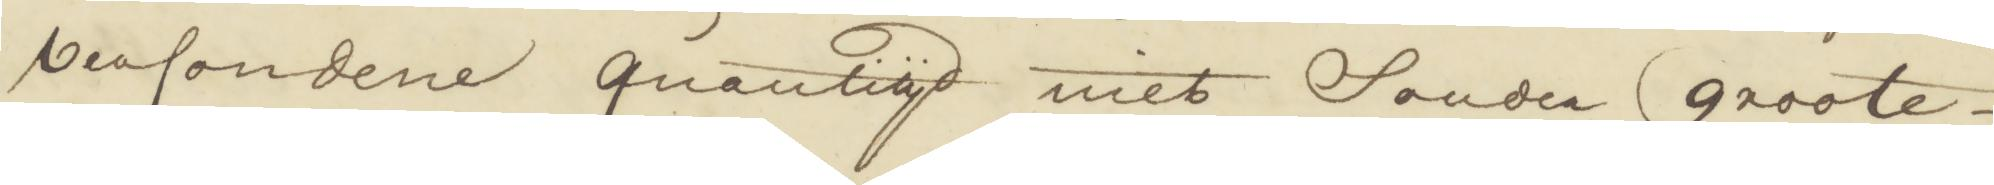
versondene quantitijt niet Sonder groote
